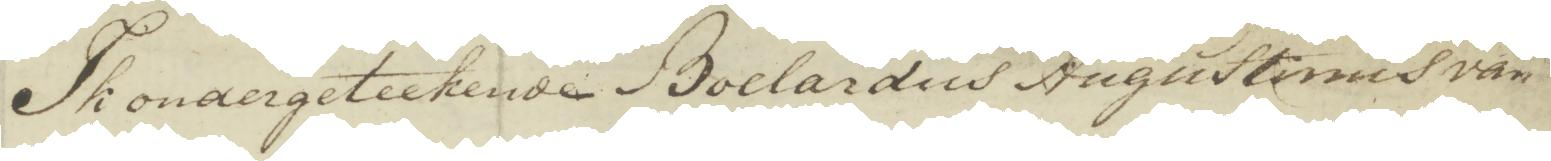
Ik ondergeteekende Boelardus Augustinus van
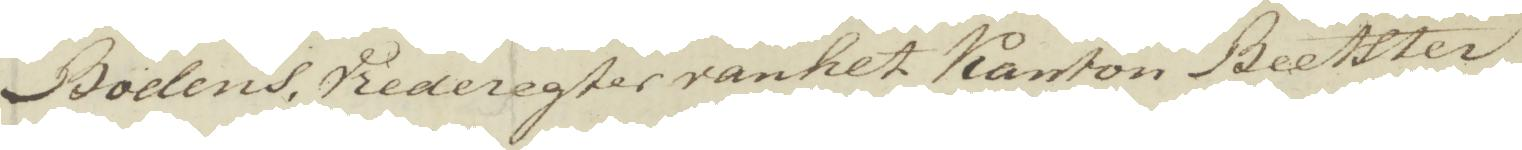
Boelens, Vrederegter van het Kanton Beetster
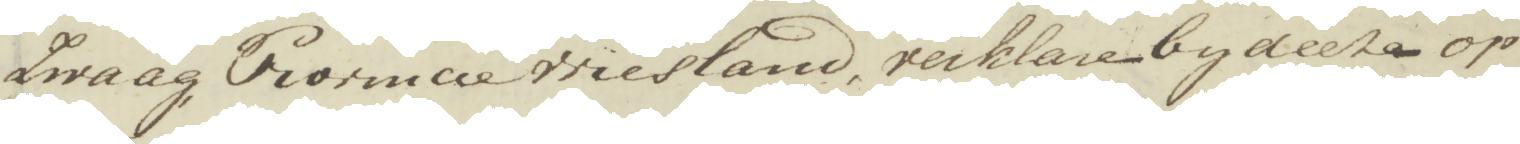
Zwaag, Provincie Vriesland, verklare by deeze op
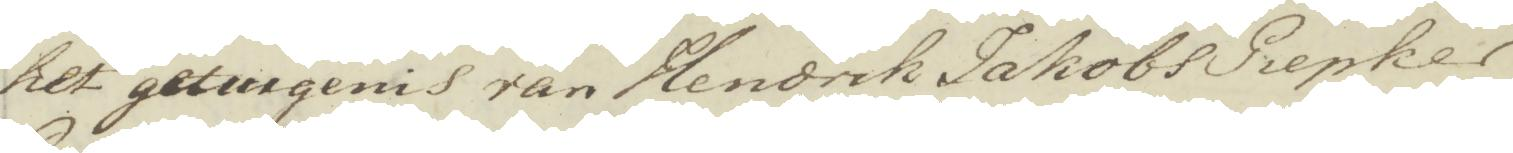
het getuigenis van Hendrik Jakobs Piepker
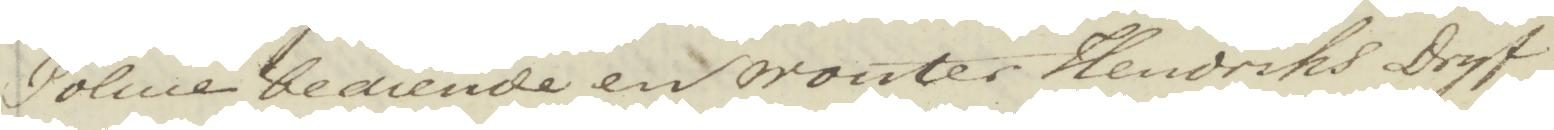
Policie bediende en wouter Hendriks Dryf
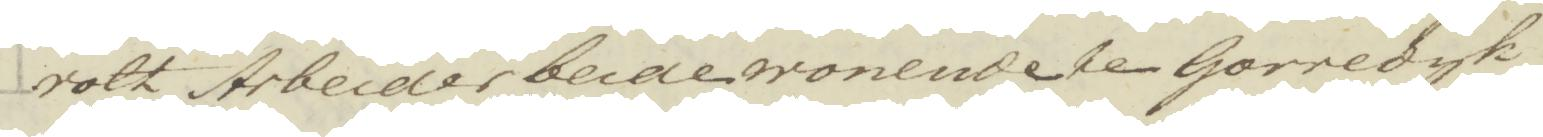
volt Arbeider beide wonende te Gorredyk
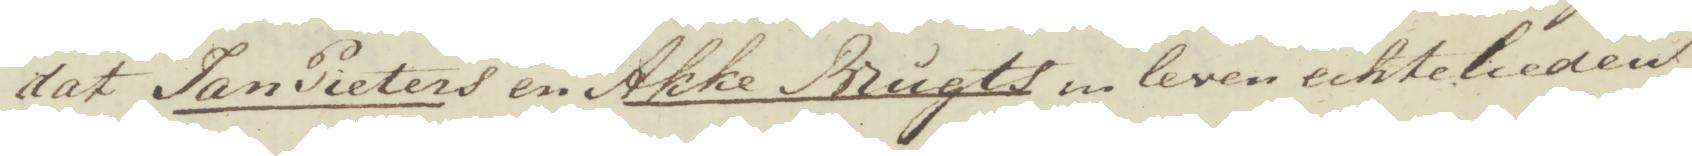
dat Ian Pieters en Akke Brugts in leven echtelieden
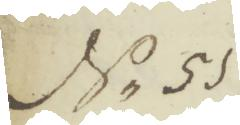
N„o 51
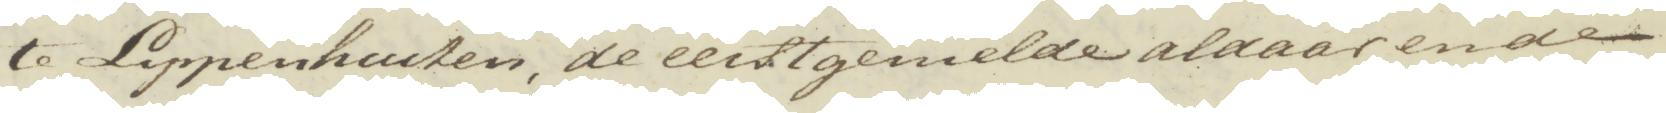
te Lippenhuizen, de eerstgemelde aldaar en de
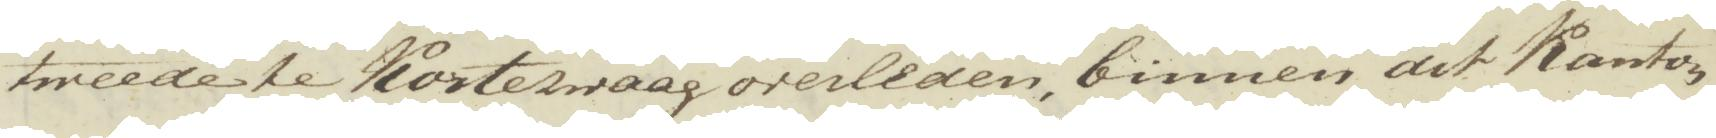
tweede te Kortezwaag overleden, binnen dit Kanton
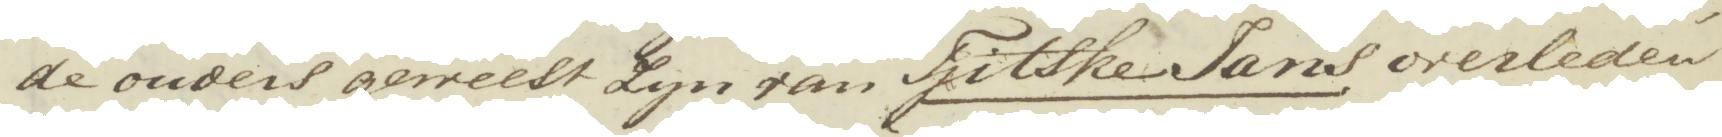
de ouders geweest zijn van Tjitske Ians overleden
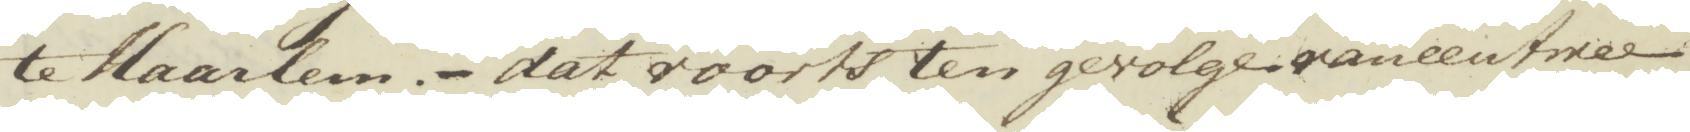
te Haarlem. - dat voorts ten gevolge vaneentwee
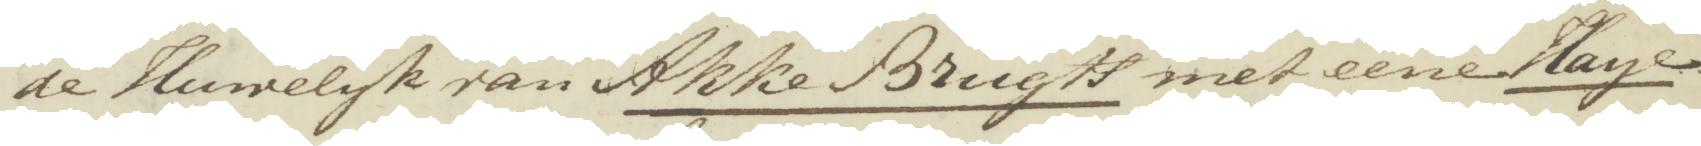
de Huwelyk van Akke Brugts met eene Haye
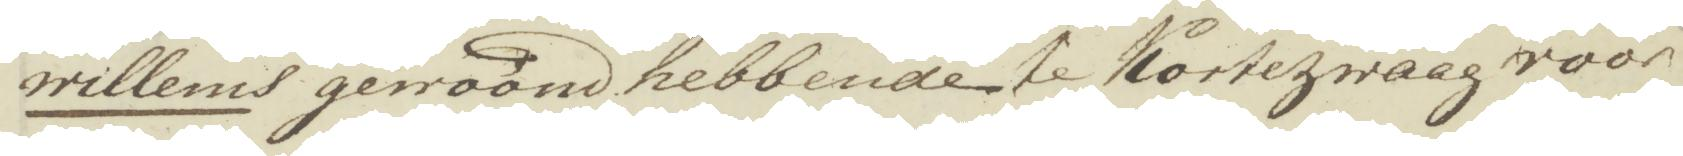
willems gewoond hebbende te Kortezwaag voor
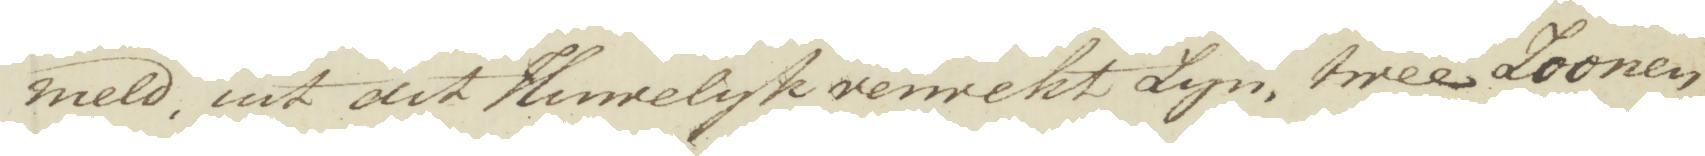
meld, uit dit Huwelyk verwekt zyn, twee Zoonen
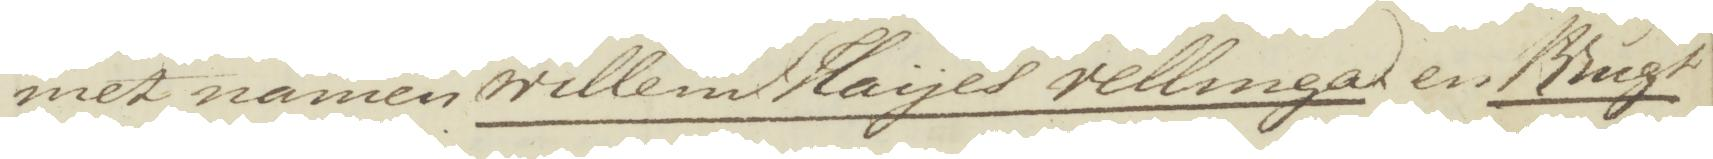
met namen willem Haijes vellinga en Brugt
